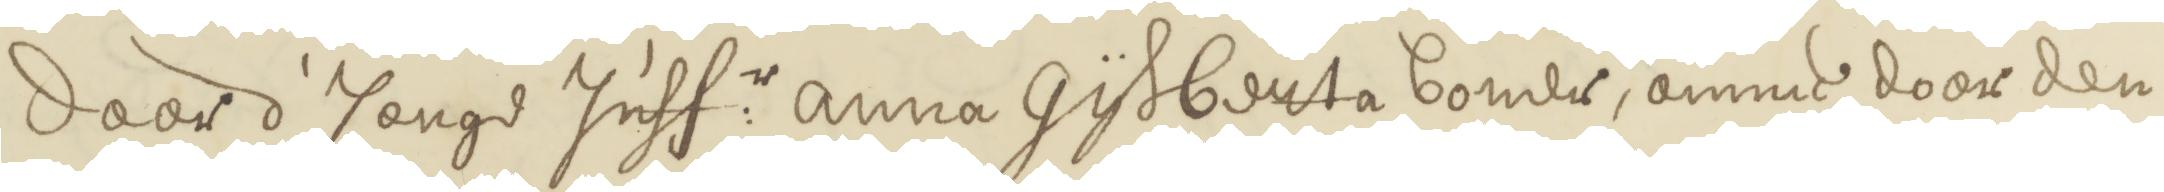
door d’ Jonge Juff:r Anna Gijsberta boner, omme door den
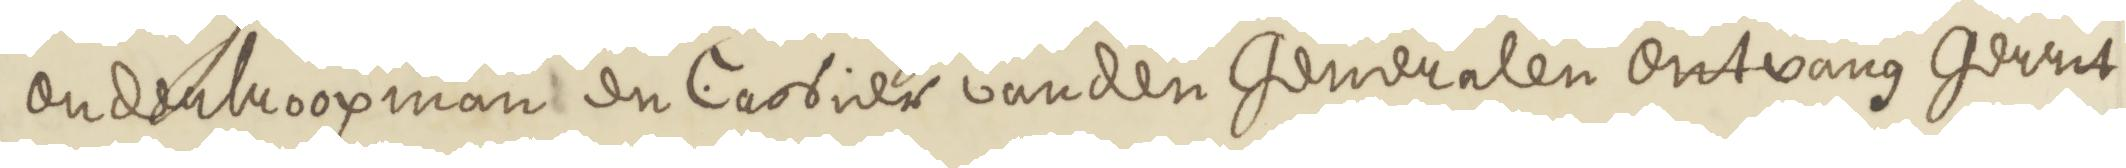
onderkoopman en Cassier van den Generalen Ontvang Gerrit
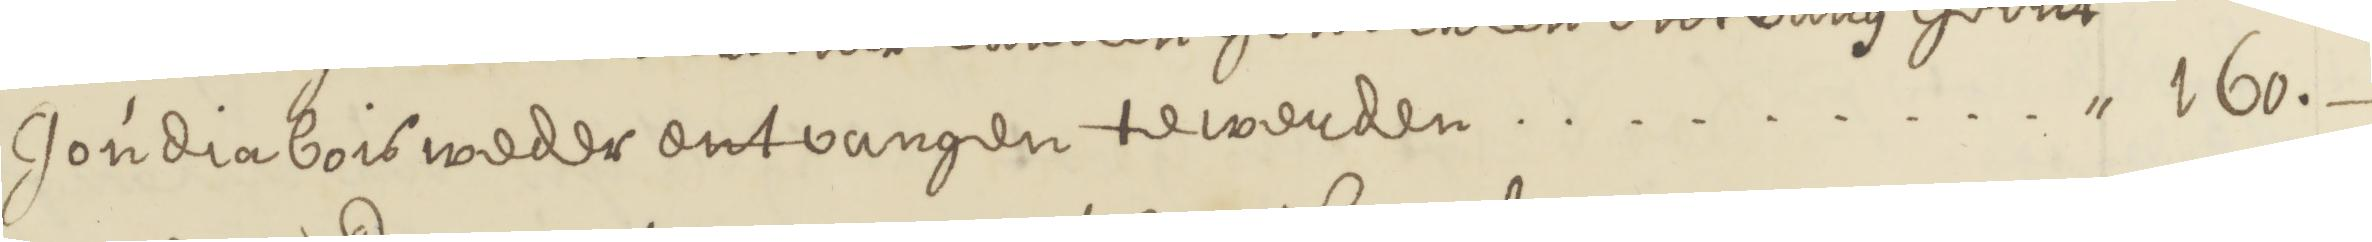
Goudiabois weder ontvangen te werden . . . . . . . . . . „ 160.—
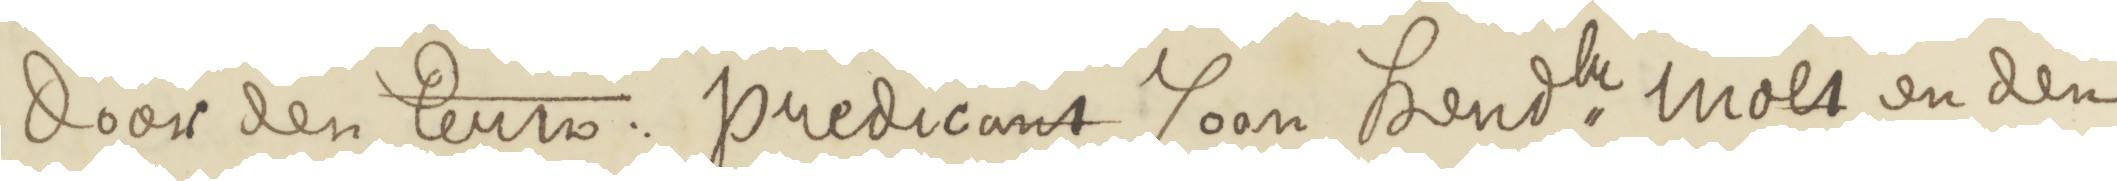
door den Eerw: predicant Joan Hend„k Molt en den
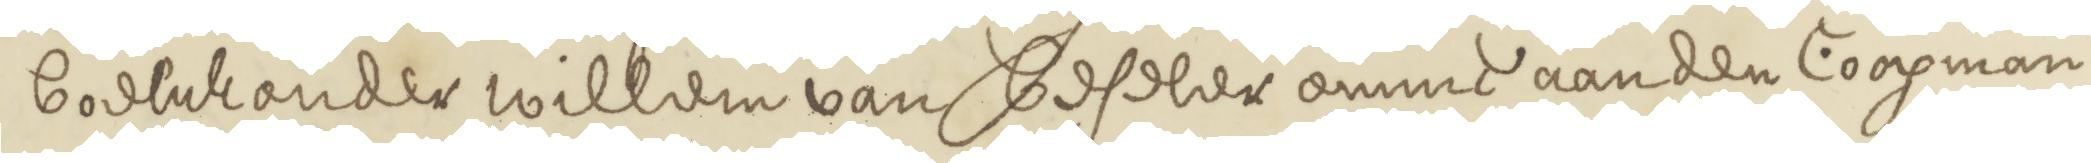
boekhouder willem van beseler omme aan den Coopman
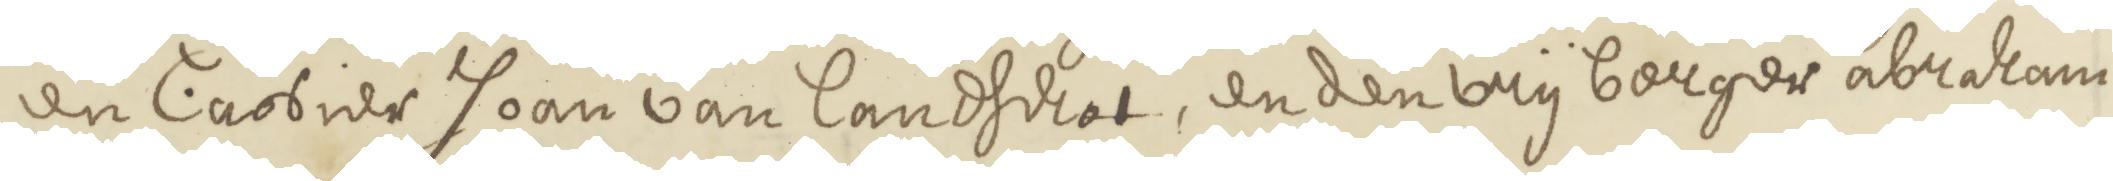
en Cassier Joan van landschot, en den vrij borger abraham
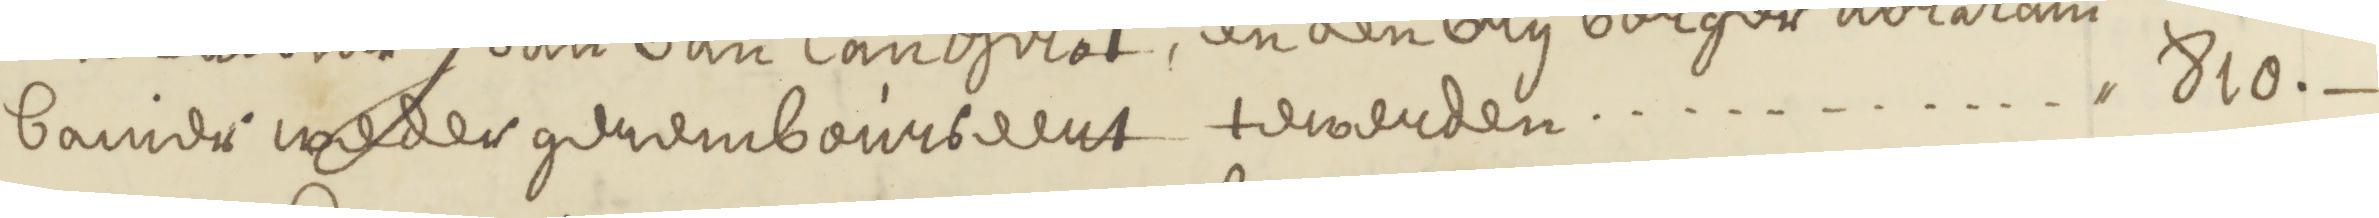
banier weder gerembourseert tewerden. . . . . . . . . . . „ 810.—
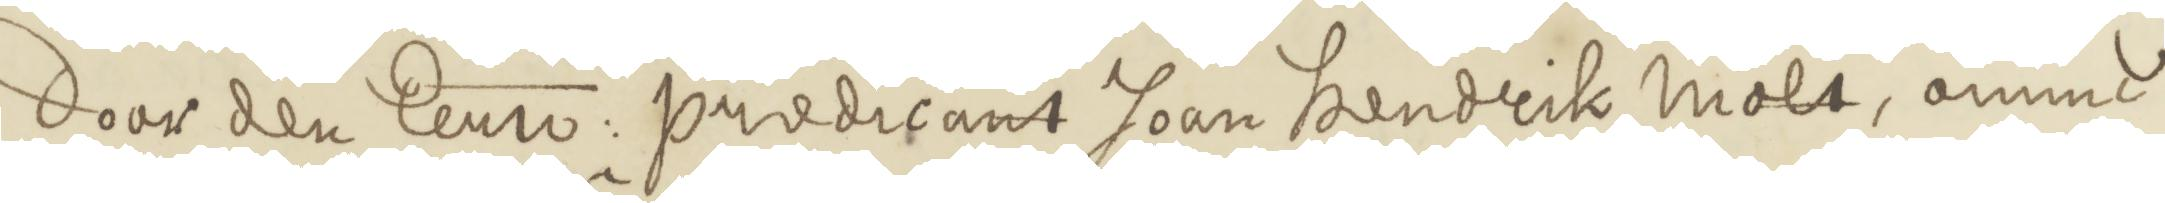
door den Eerw: predicant Joan Hendrik Molt, omme
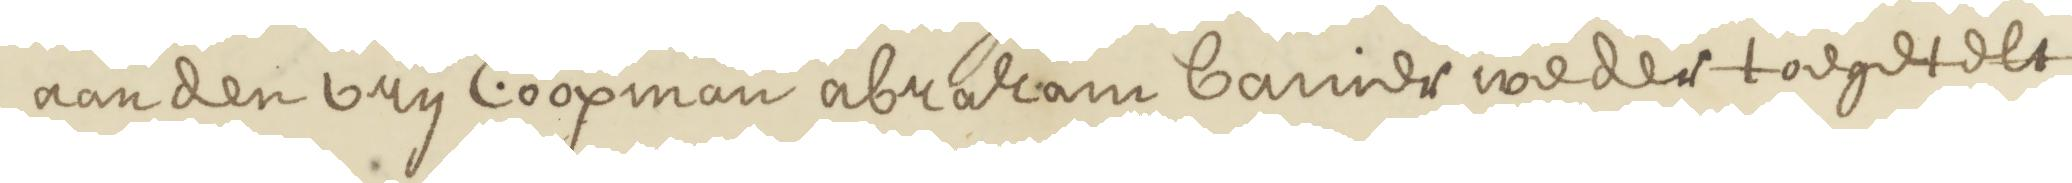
aan den vrij Coopman abraham banier weder toegetelt
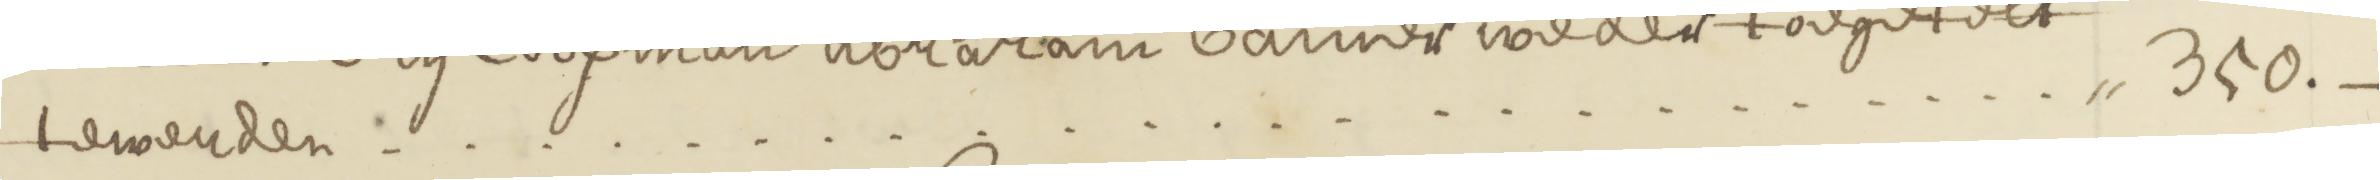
te werden. . . . . . . . . . . . . . . . . . . . . . . . „ 350.—
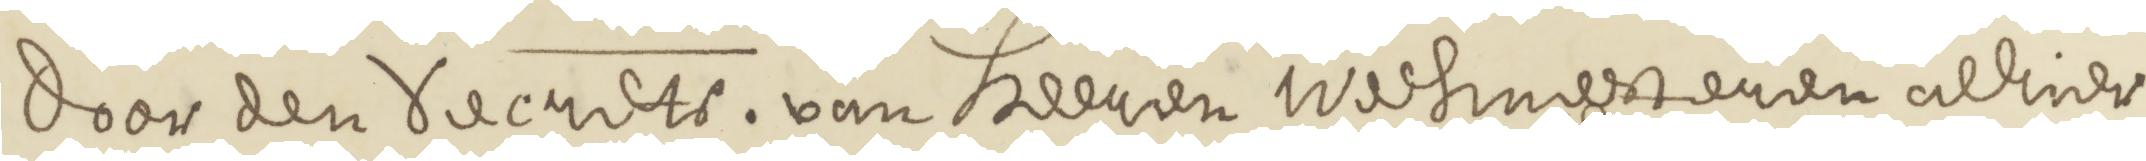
door den secrets. van Heeren weesmeesteren alhier
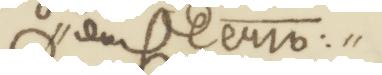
den Eerw:„
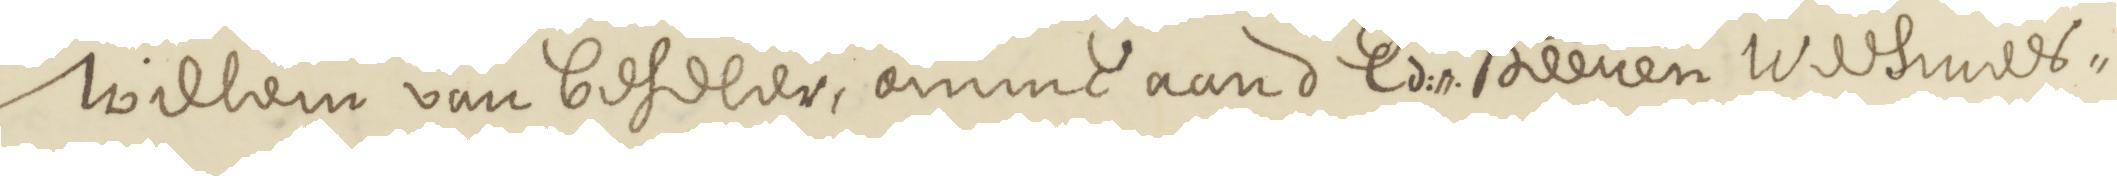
Willem van beseler, omme aan d’ Ed:„ heeren weesmees„
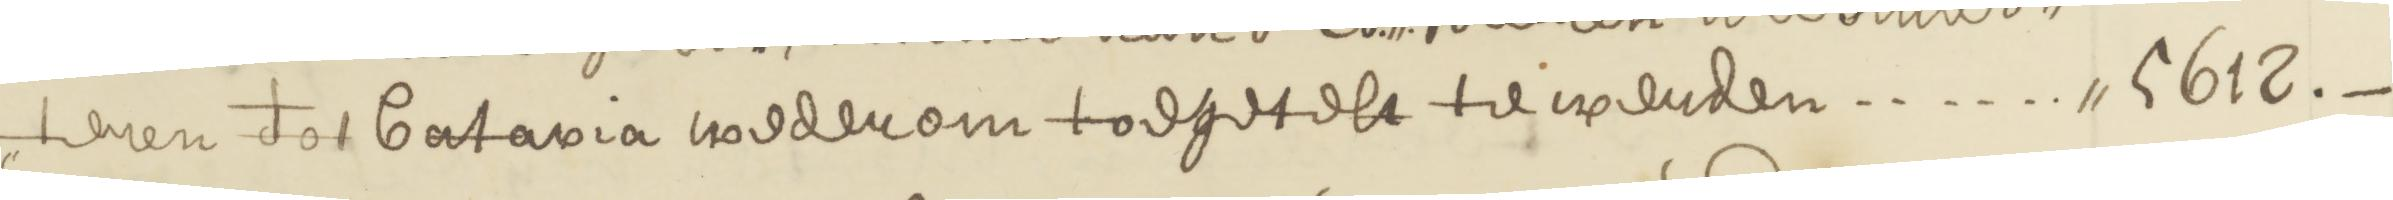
„teren tot batavia wederom toe getelt te werden - - - - - - „ 5612.—
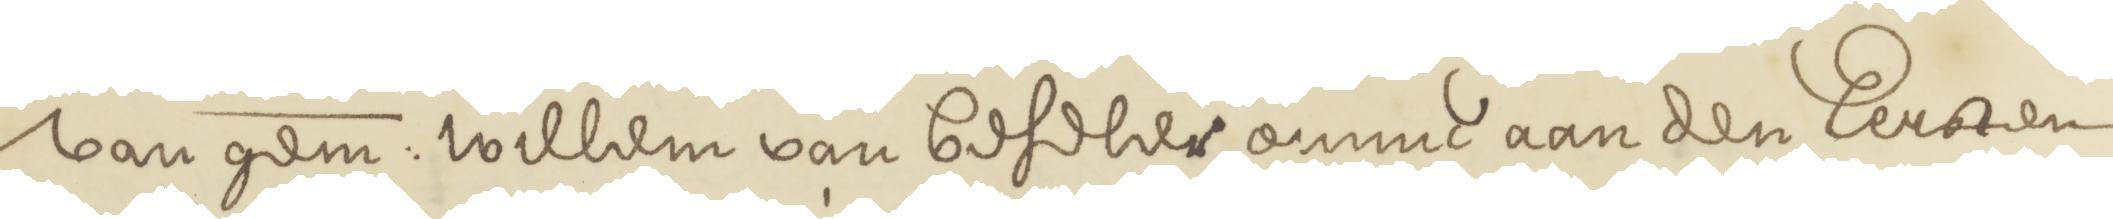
van gem: willem van beseler omme aan den Eersten
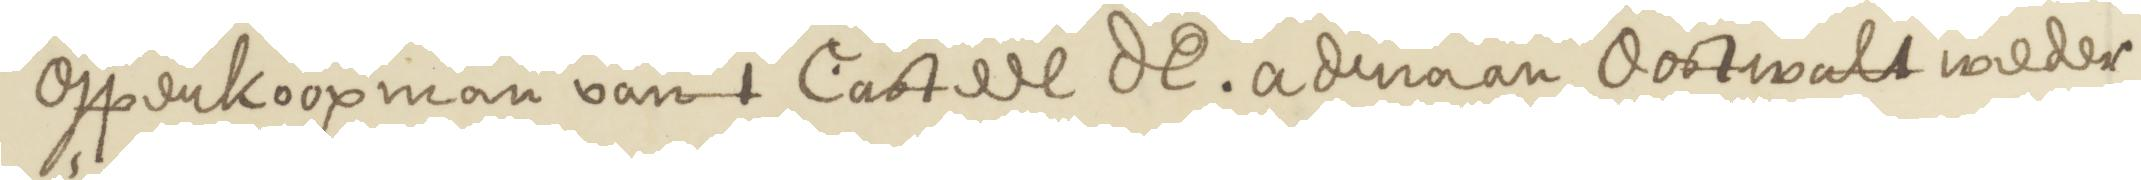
Opperkoopman van ’t Casteel dE. adriaan Oostwalt weder
